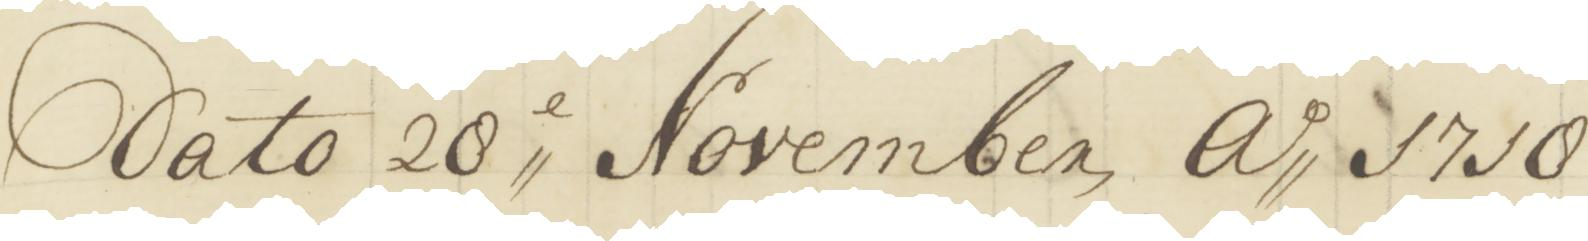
dato 28„e November a„o 1718
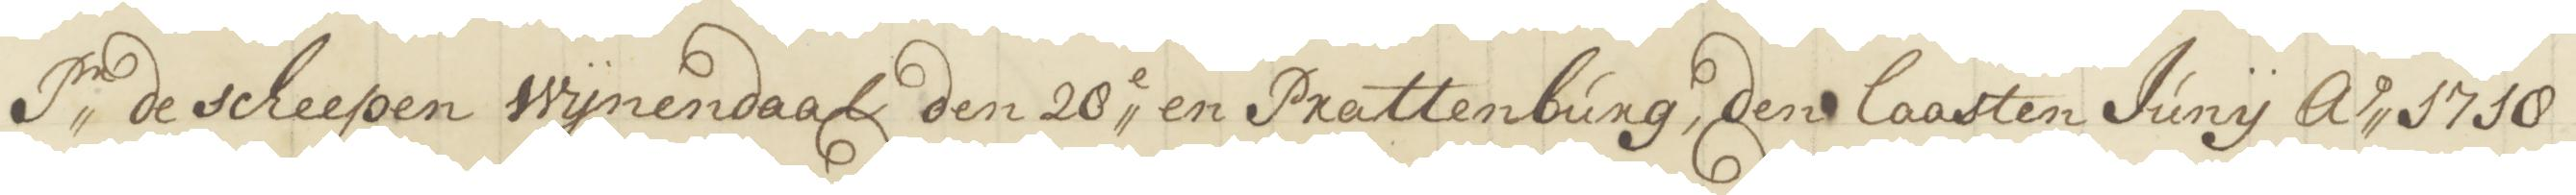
P„r de scheepen Wijnendaal den 20„e en Prattenburg, den laasten Junij a„o 1718
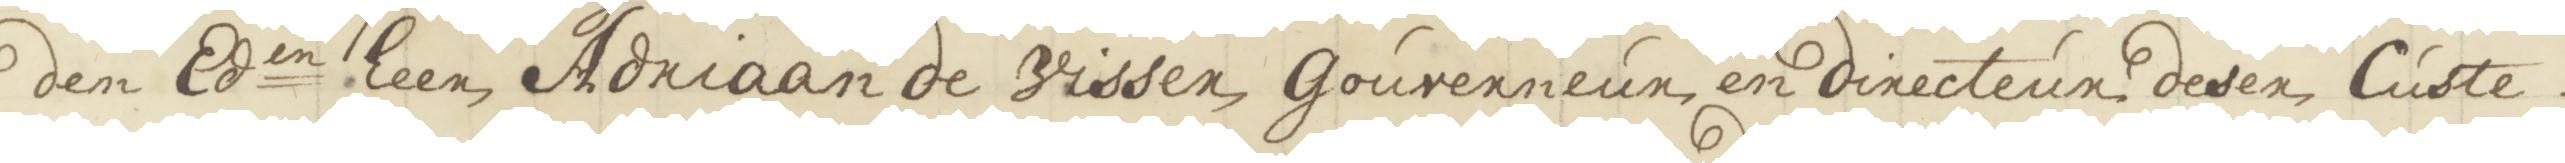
den Ed=en heer Adriaan de Visser gouverneur en directeur deser Custe —
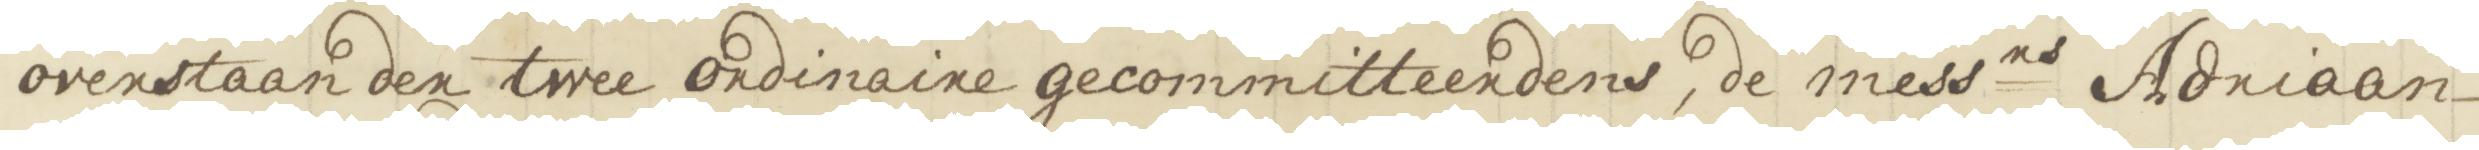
overstaan der twee ordinaire gecommitteerdens, de mess=rs Adriaan
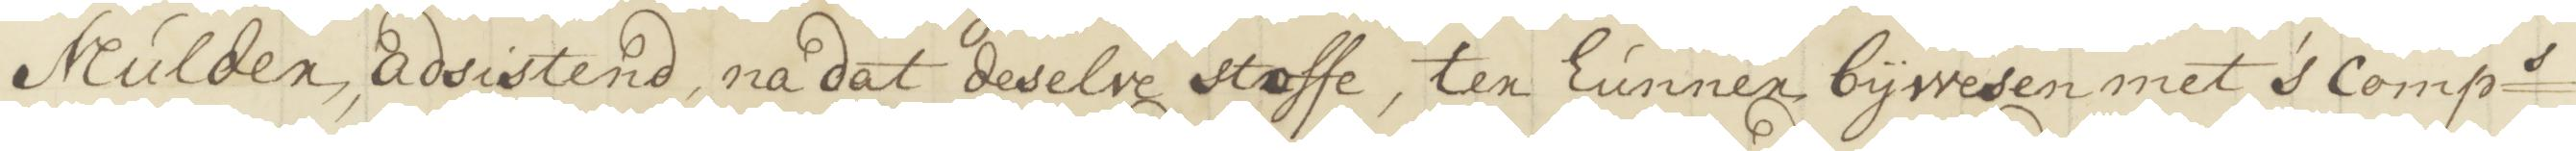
Mulder, adsistend, na dat deselve stoffe, ter hunner bij wesen met ’s Comp=s
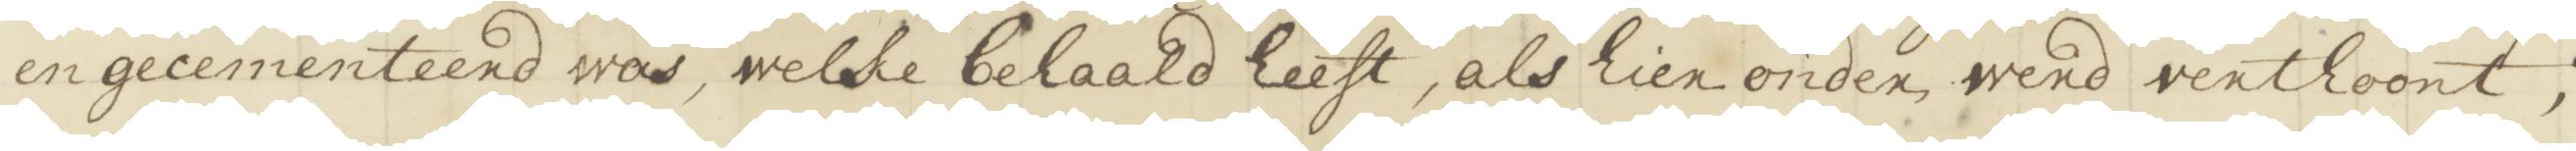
en gecementeerd was, welke behaald heeft, als hier onder werd verthoont;
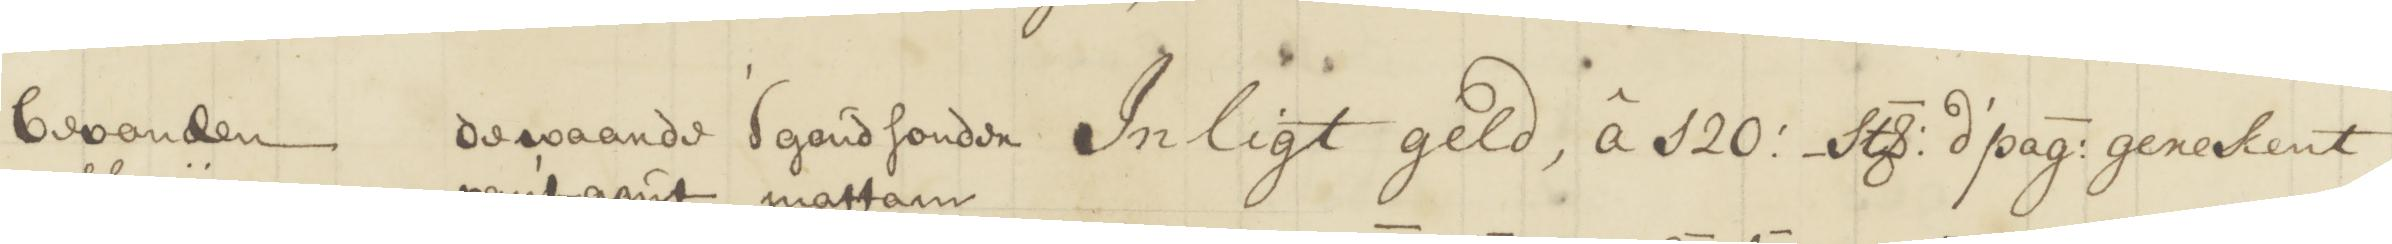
bevonden de waarde 't goud sonder In ligt geld, â 120: _stver: d' pag: gerekent
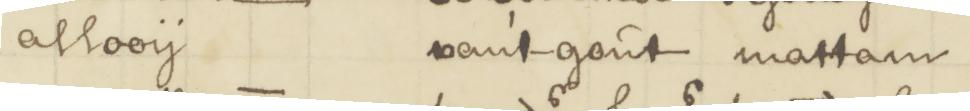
allooij van ’t gout mattam
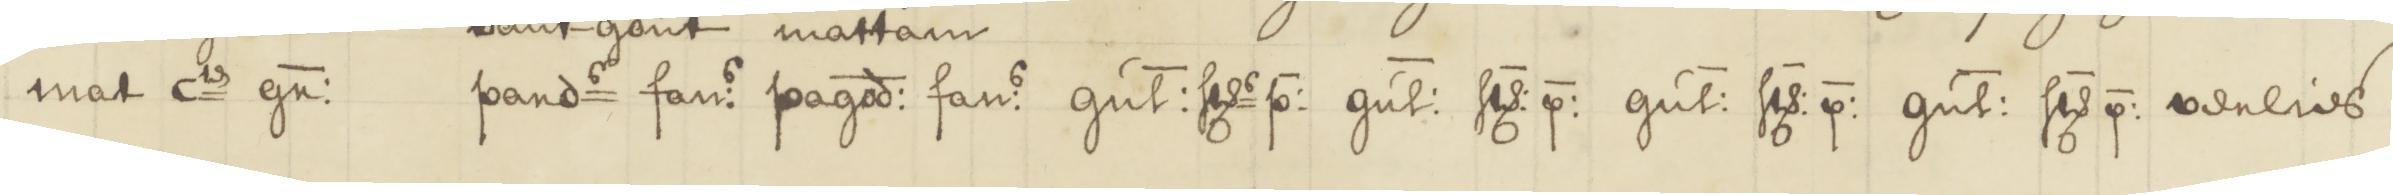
mat c=ten gr: pand=s fan:s pagod: fan:s gul: stver=s p: gul: stver: p: gul: stver p: gul: stver: p: verlies
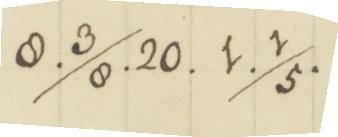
8.3/8.20. 1.1/5.
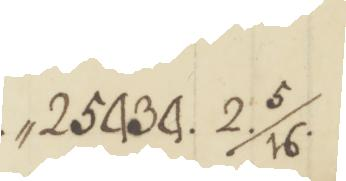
„25434.2.5/16.
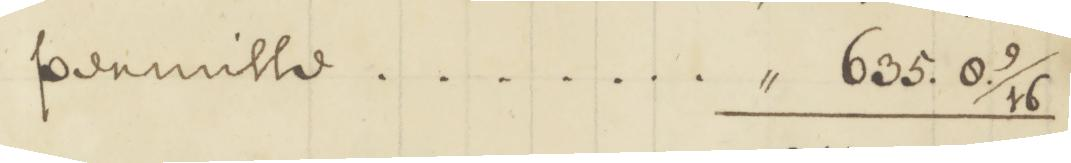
permille . . . . . . . .„ 635.8.9/16
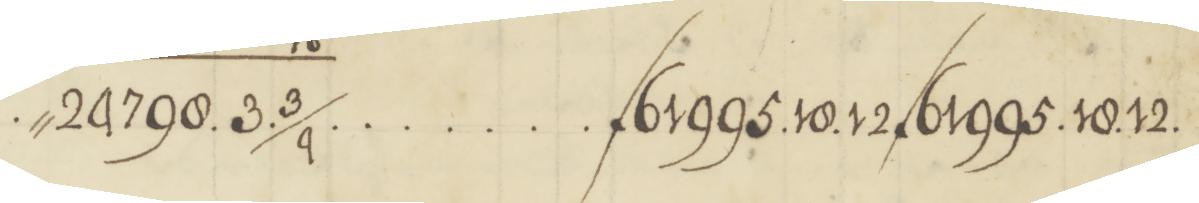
„24798.3.¾. . . . . . . ƒ61995.18.12 ƒ61995.18.12.
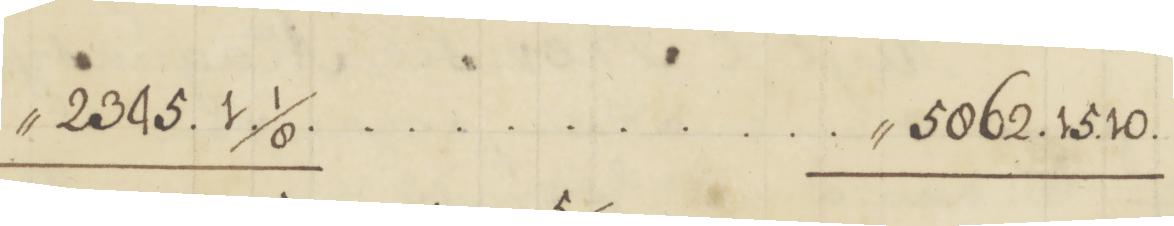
„2345.1.1/8. . . . . . . . . . . . „5862.15.10.
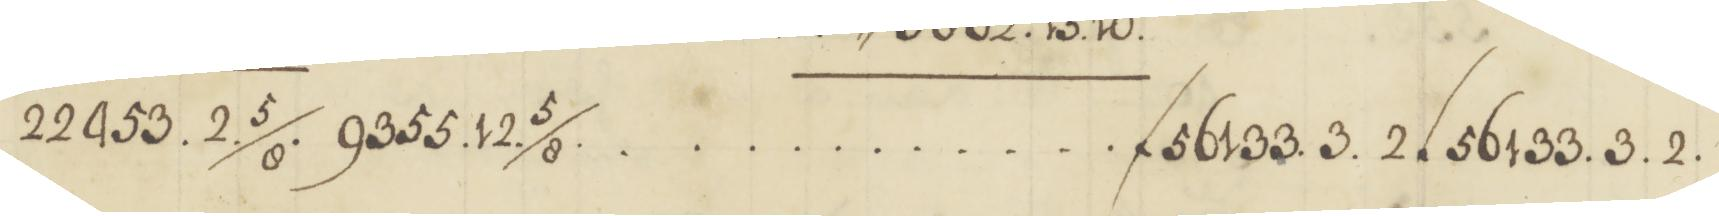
22453.2.5/8. 9355.12.5/8. . . . . . . . .. . . . . . . . . . . . . . . .ƒ 56133.3.2 ƒ56133.3.2.
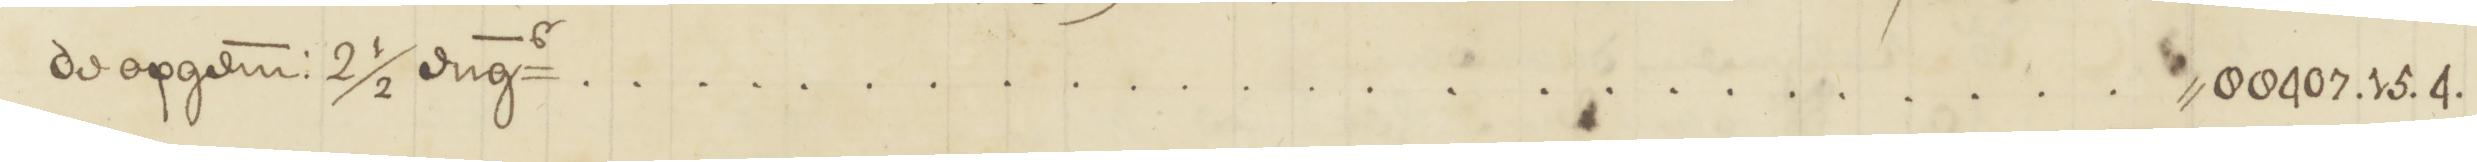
de op gem: 2½ eng=s. . . . . . . . . . . . . . . . . . . . . . . . . . . . . . . . . . .. . „88407.15.4.
